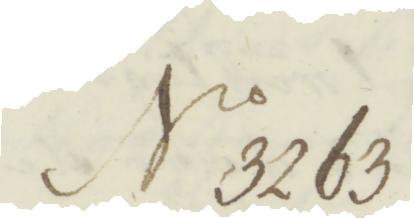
No 3263
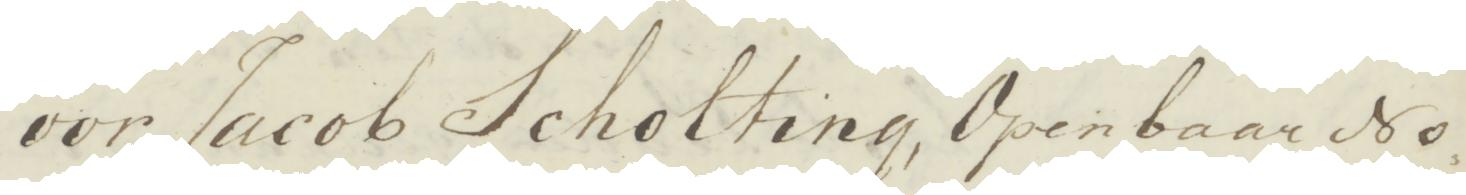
Voor Jacob Scholting, Openbaar No„
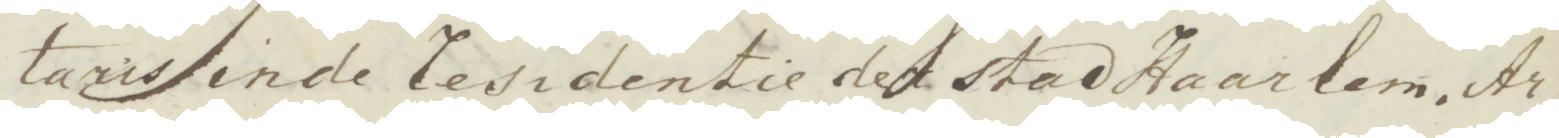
taris in de residentie der stad Haarlem, Ar
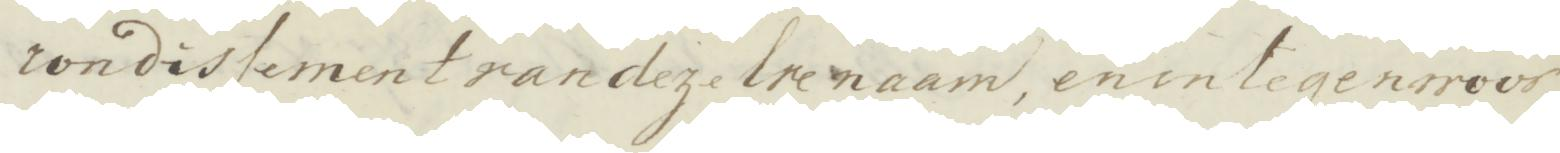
rondissement van dezelve naam, en in tegenwoor
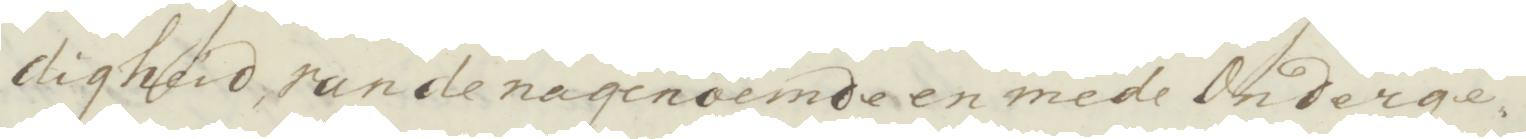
digheid van de nagenoemde en mede Onderge„
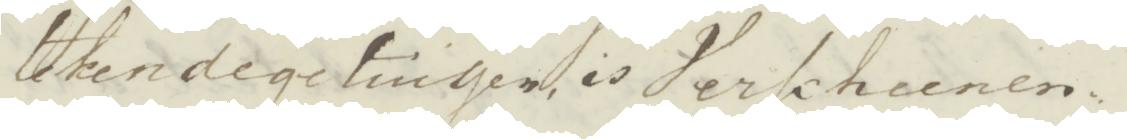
tekende getuigen, is Verscheenen.
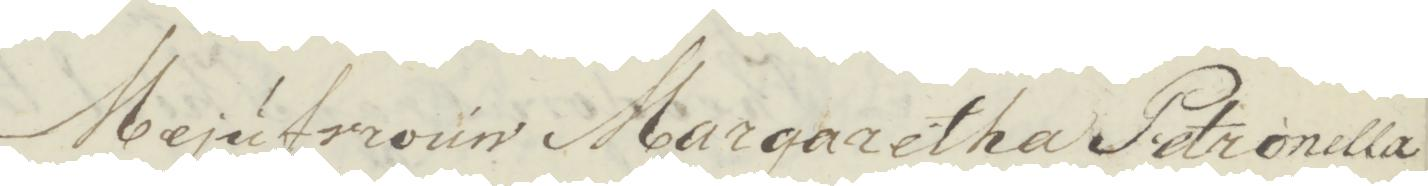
Mejufvrouw Margaretha Petronella
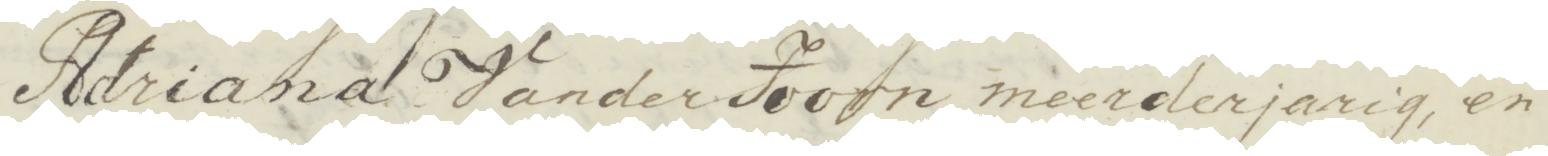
Adriana Van der Toorn, meerderjarig, en
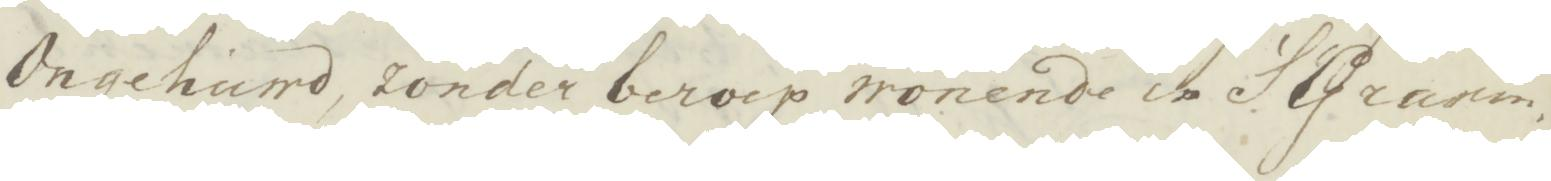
Ongehuwd, zonder beroep wonende in 'S Graven„
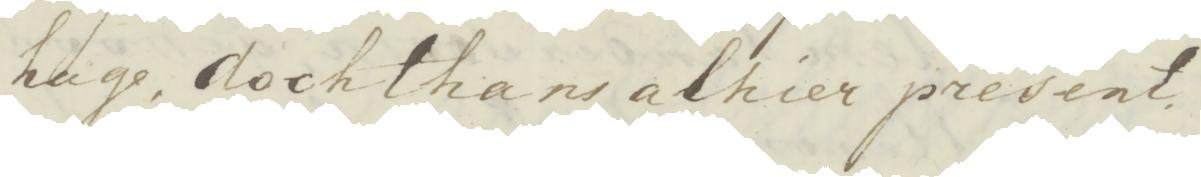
hage, doch thans alhier present.
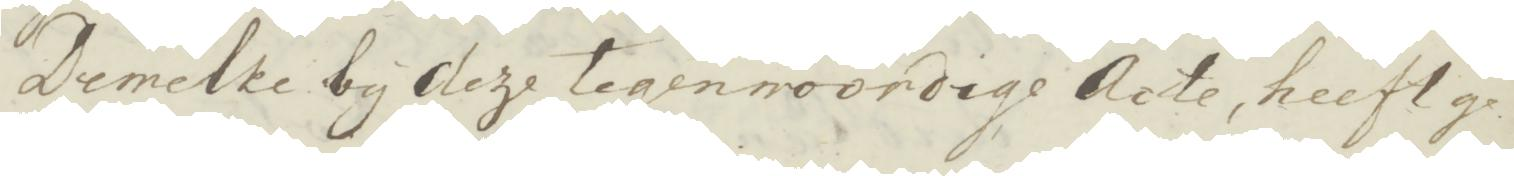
Dewelke bij deze tegenwoordige Acte, heeft ge
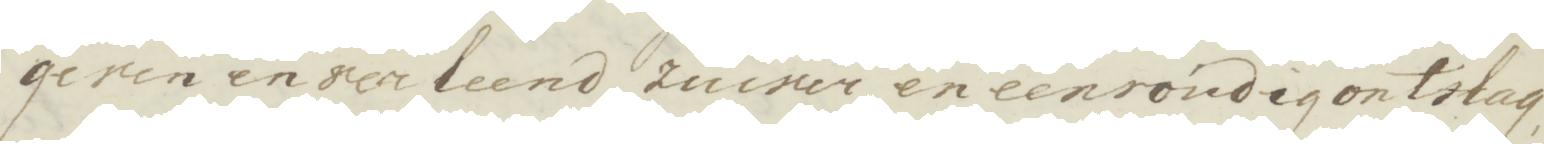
geven en verleend, zuiver en eenvoudig ontslag
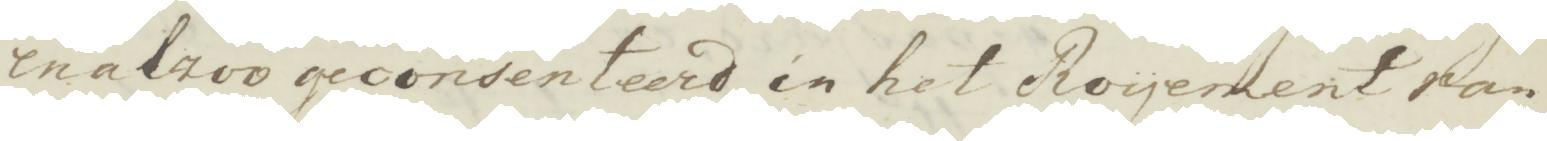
en alzoo geconsenteerd, in het Roijement van
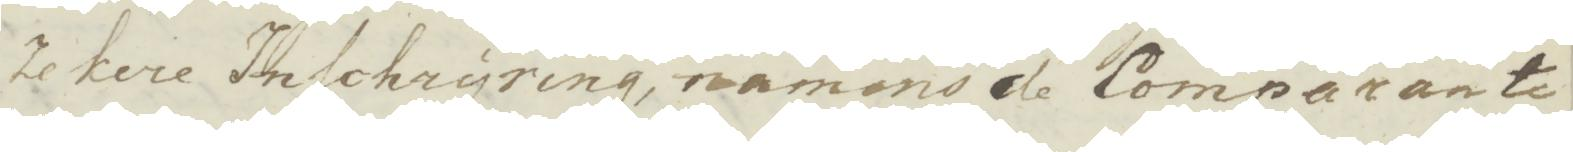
zekere Inschrijving, namens de Comparante
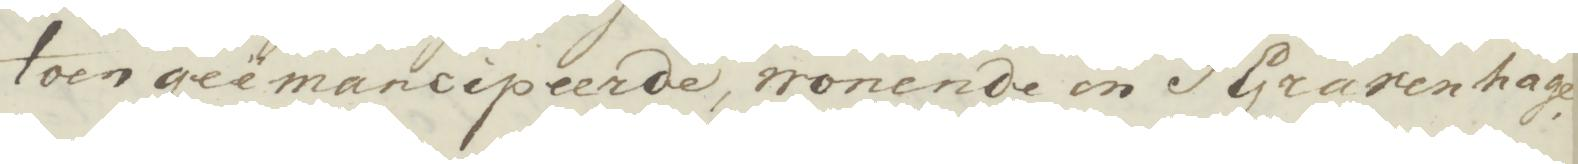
toen geëmancipeerde, wonende in 'S Gravenhage
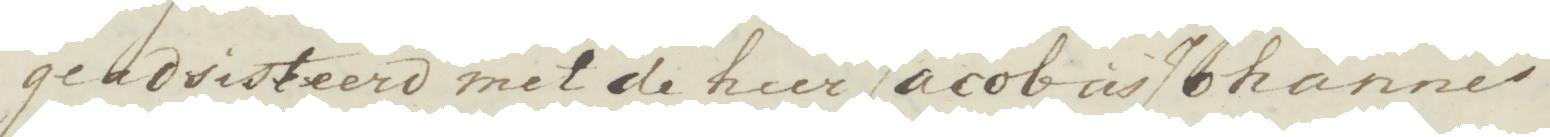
geadsisteerd met de heer Jacobus Johannes
